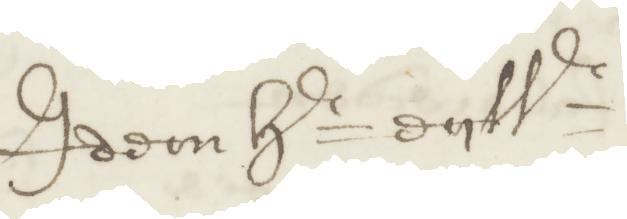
Idem H=r eyss=r
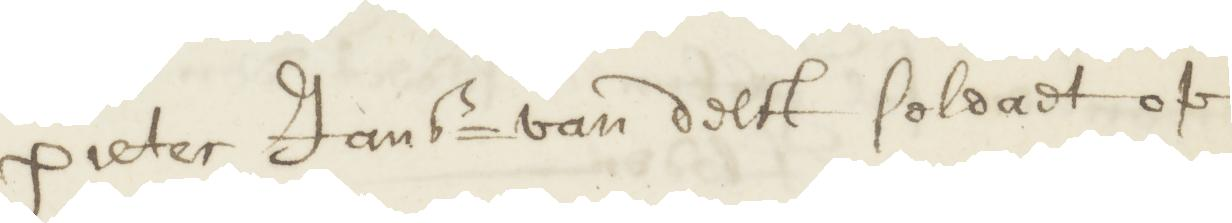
pieter Jans=s van delft soldaet op
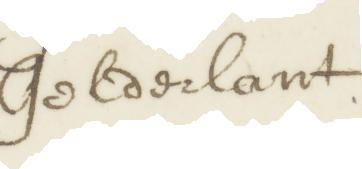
Gelderlant
